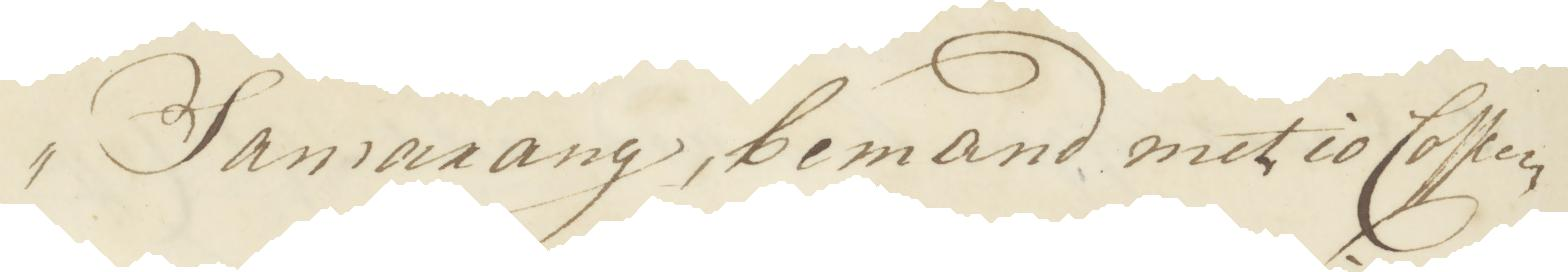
1: _=o „ Samarang, bemand met 10 Coppen
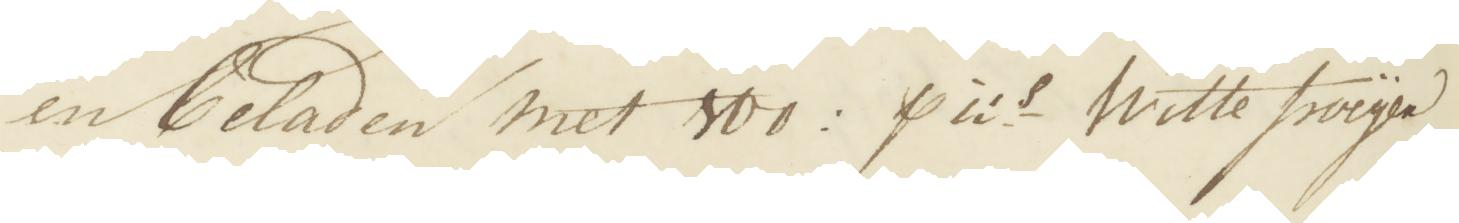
en beladen met 100: pic=s witte poeijer
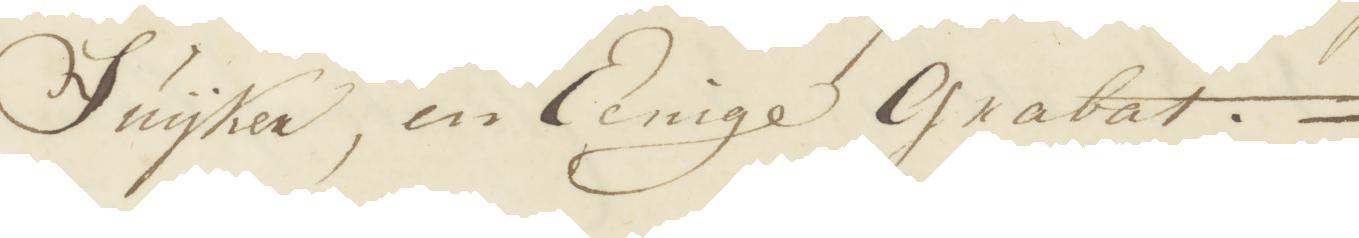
Suijker, en Eenige grabat.
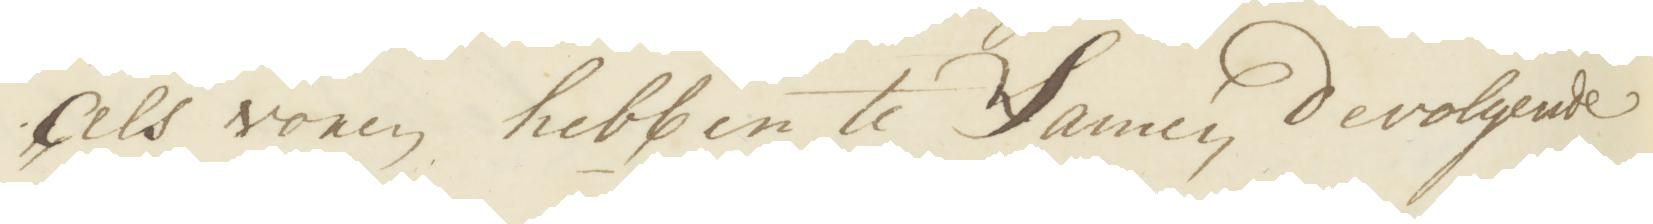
16: _=o als voren hebben te Samen de volgende
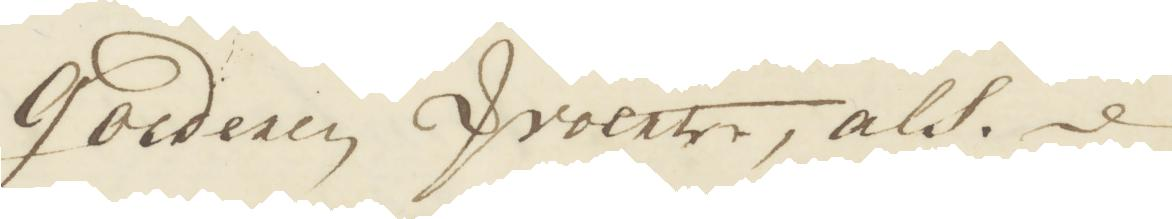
goederen vervoert, als.
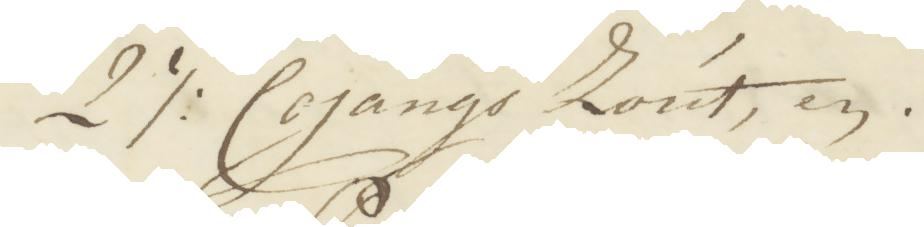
27: Cojangs zout, en.
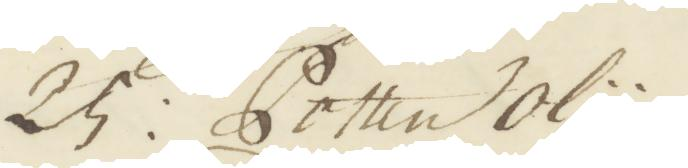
25: Potten olij,
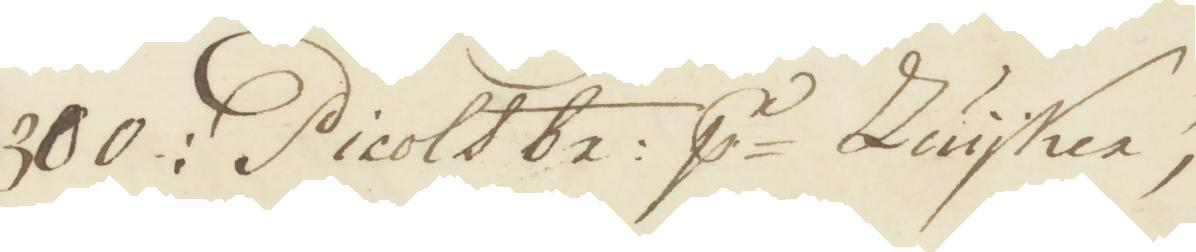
300: Picols br: p=r zuijker;
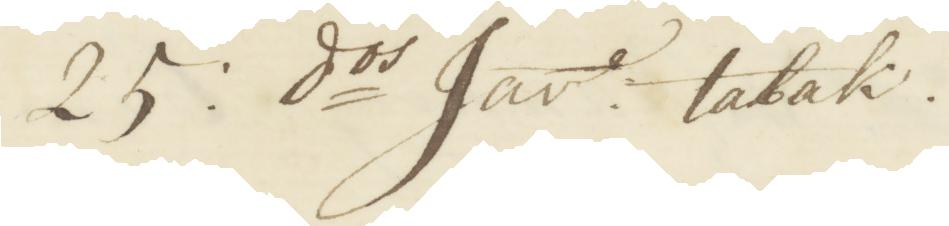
25: d=os Jav:e tabak.
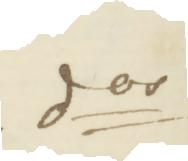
5: d=os
